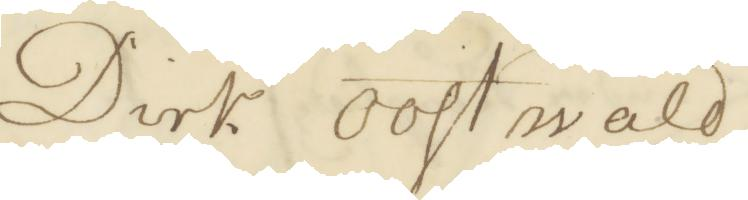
Dirk Oostwald
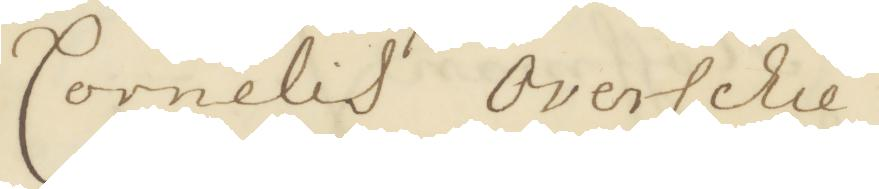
Cornelis Overschie
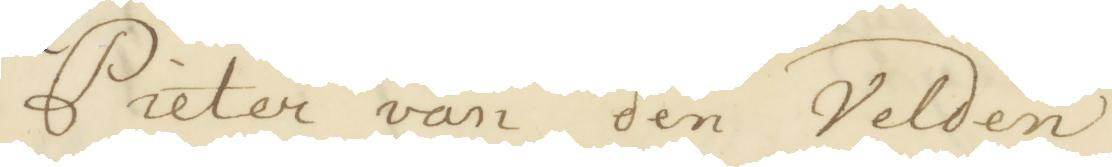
Pieter van den Velden
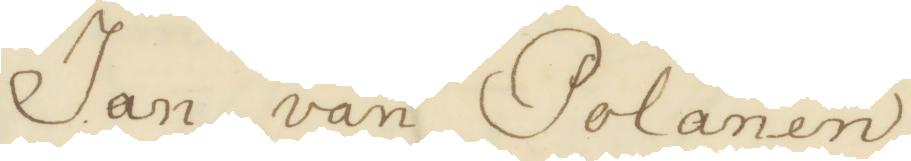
Jan van Polanen
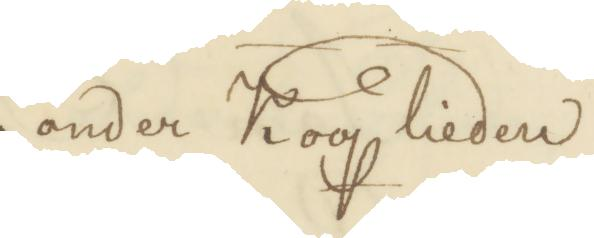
onder Kooplieden
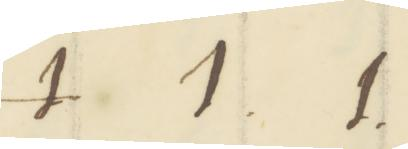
1. 1 1
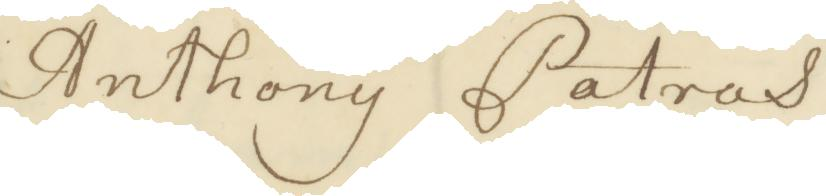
Anthonij Patras
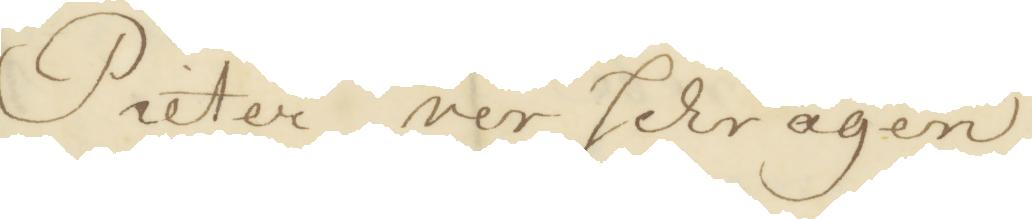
Pieter ver Schragen
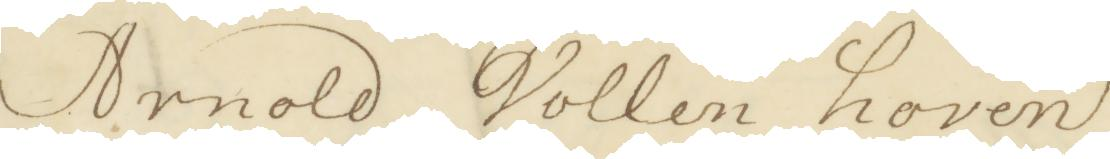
Arnold Vollen hoven
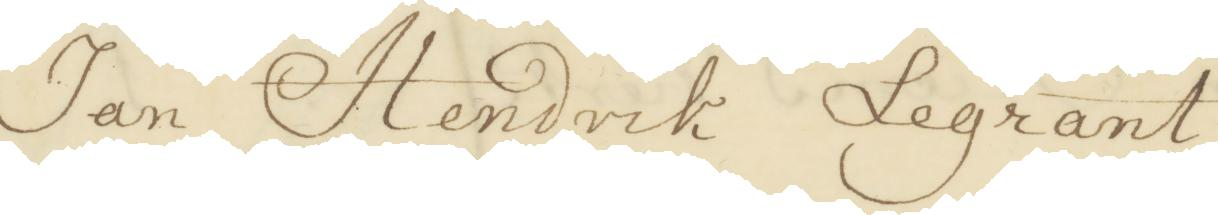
Jan Hendrik Legrant
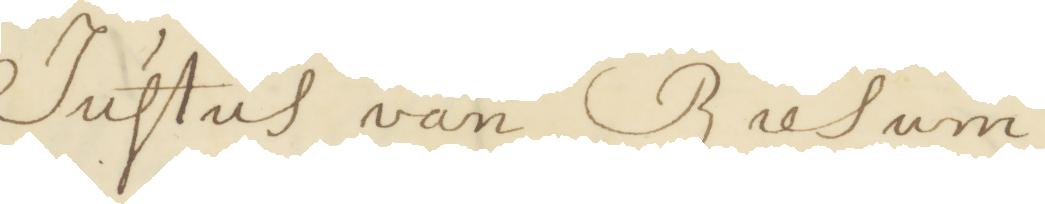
Justus van Biesum
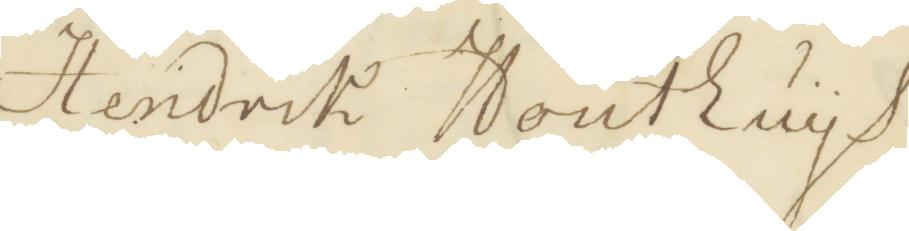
Hendrik Wouthuijs
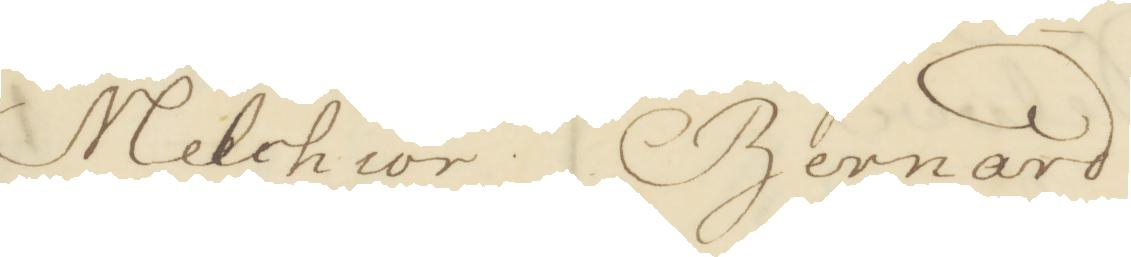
Melchior Bernard
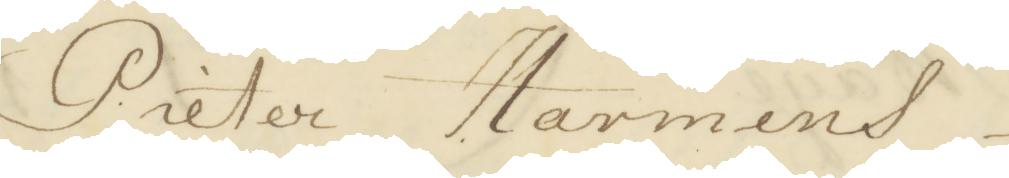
Pieter Harmens
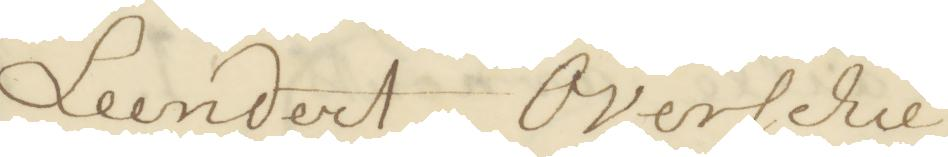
Leendert Overschie
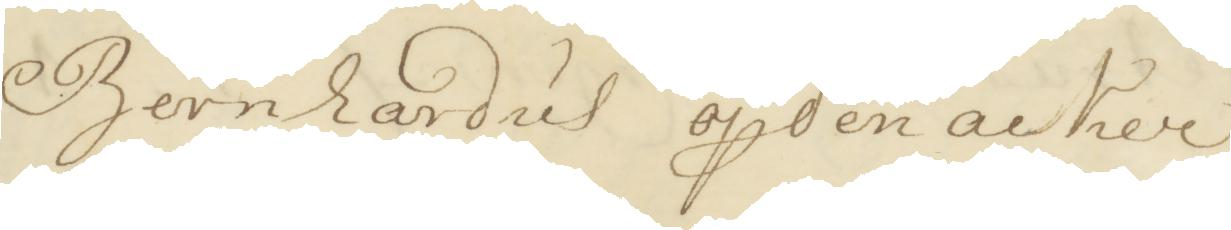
Bernhardus op den acker
